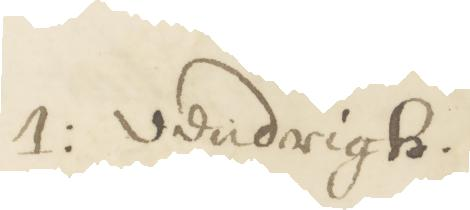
1: vendrigh.
